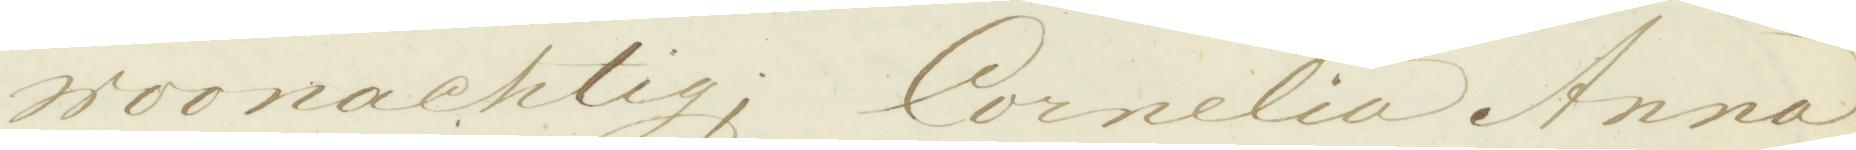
woonachtig; Cornelia Anna
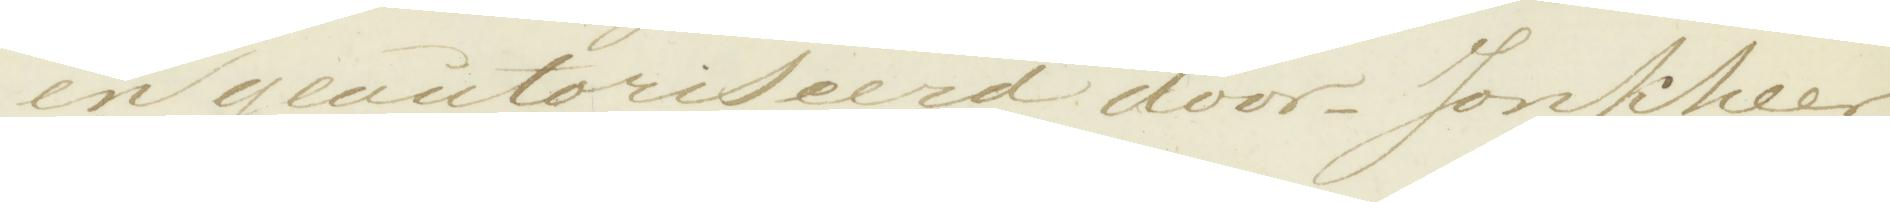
en geautoriseerd door - Jonkheer
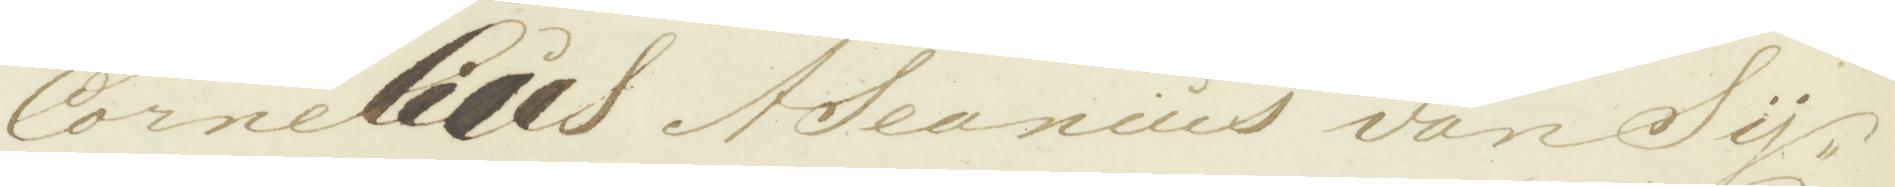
Cornelius Aseanius van Sij„
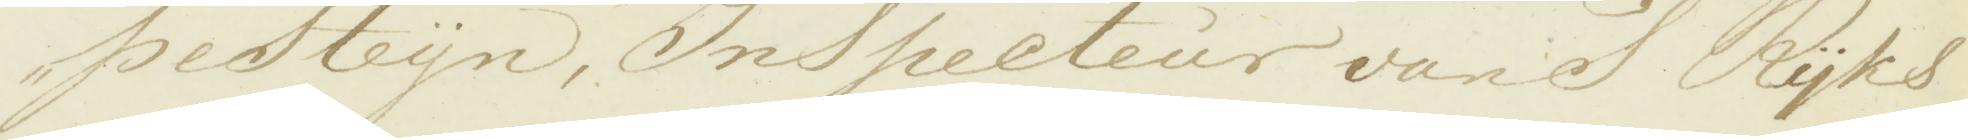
„pesteijn, Inspecteur van 's Rijks
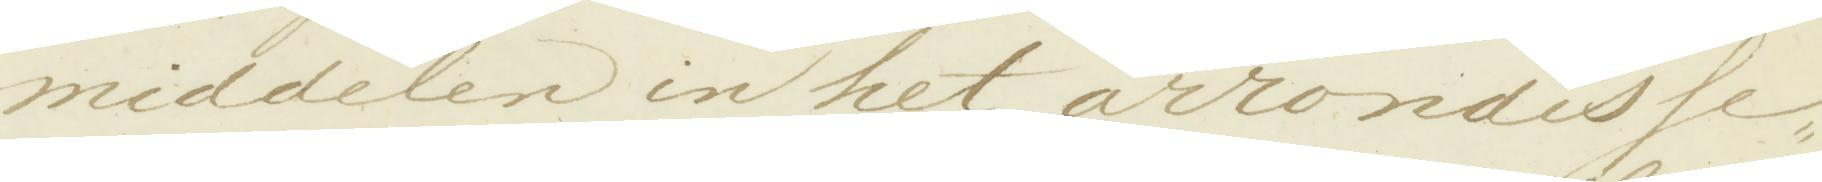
middelen in het arrondisse„
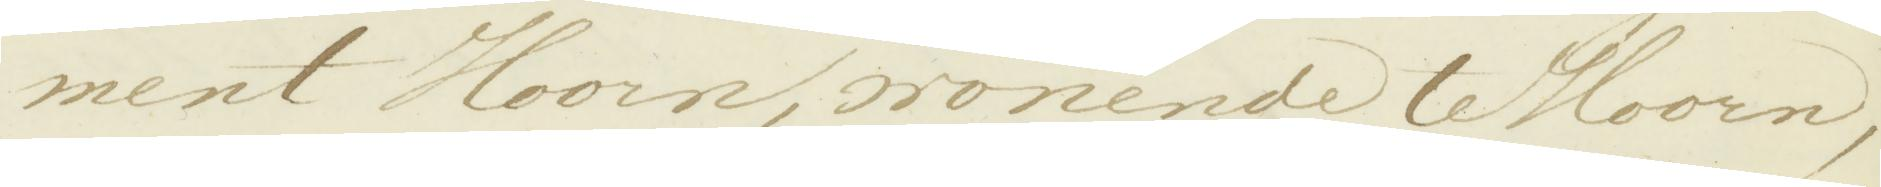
ment Hoorn, wonende te Hoorn;
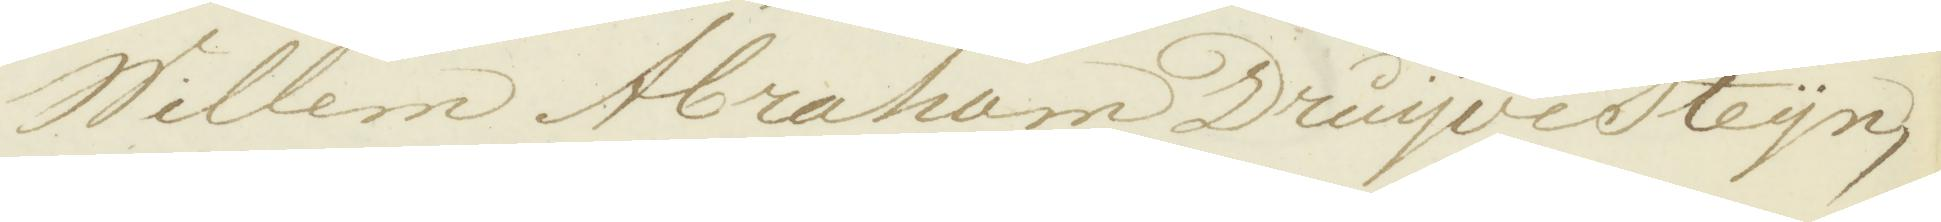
Willem Abraham Druijvesteijn,
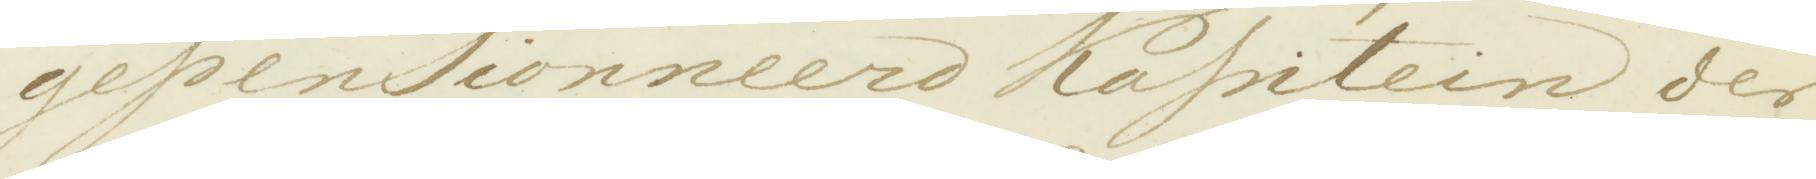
gepensionneerd kapitein der
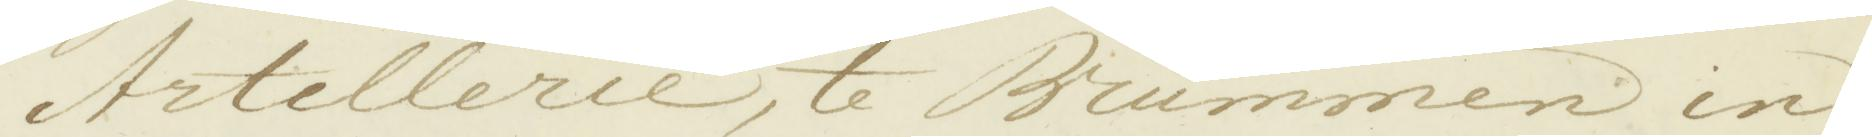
Artellerie, te Brummen in
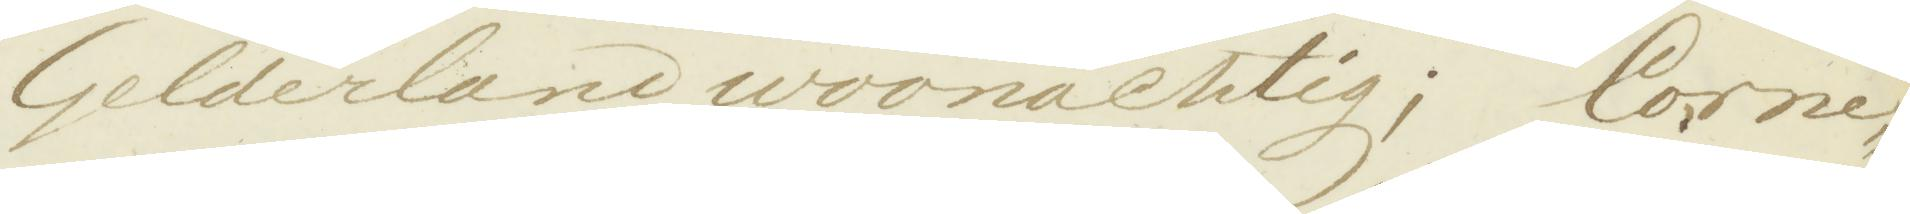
Gelderland woonachtig; Corne„
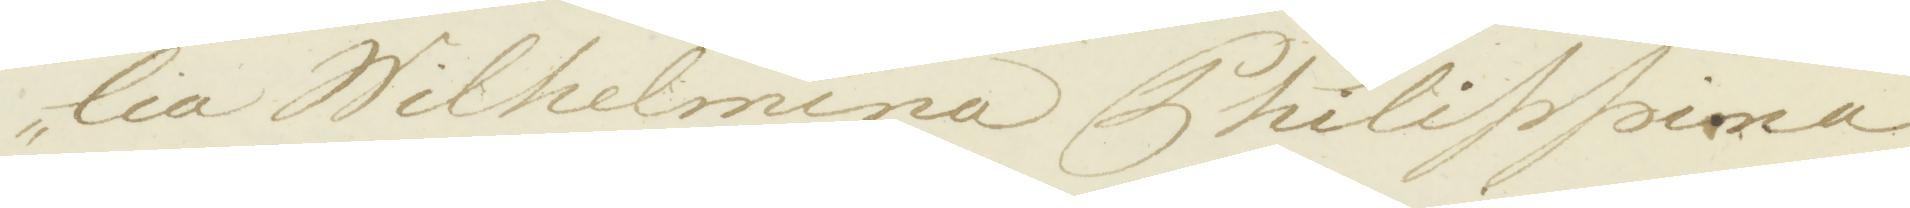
„lia Wilhelmina Philippina
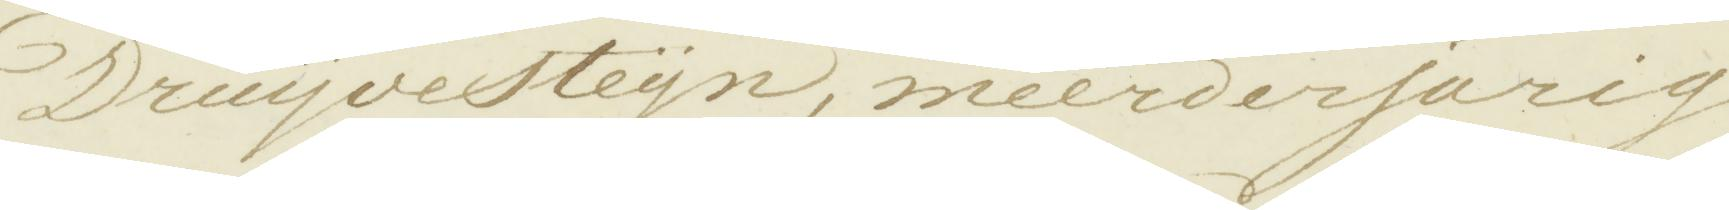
Druijvesteijn, meerderjarig,
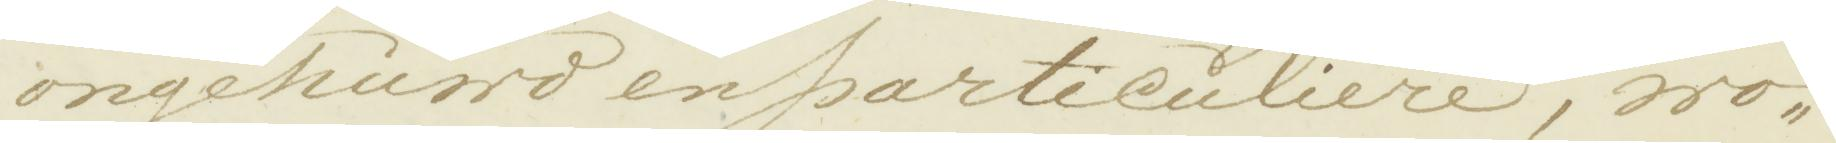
ongehuwd en particuliere, wo„
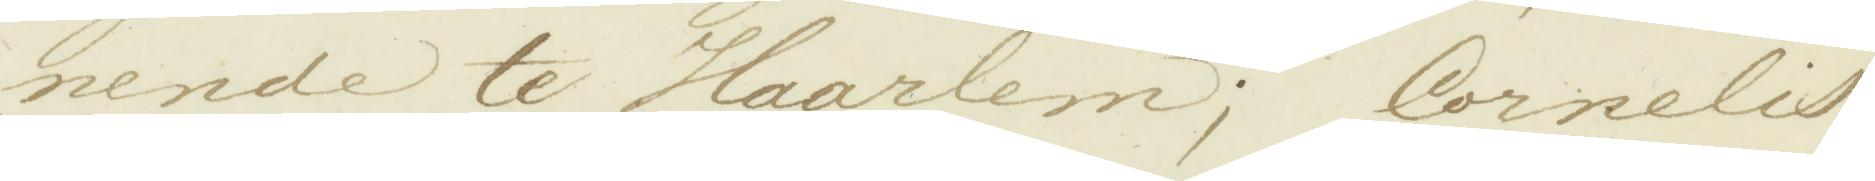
nende te Haarlem; Cornelis
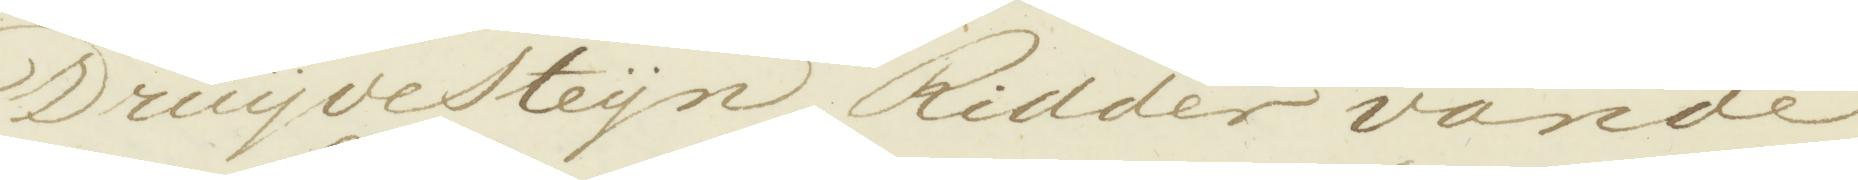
Druijvesteijn, Ridder van de
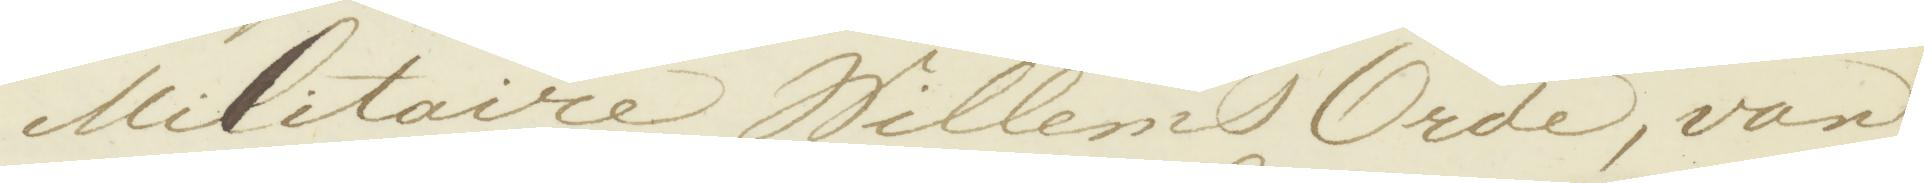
Militaire Willems Orde, van
